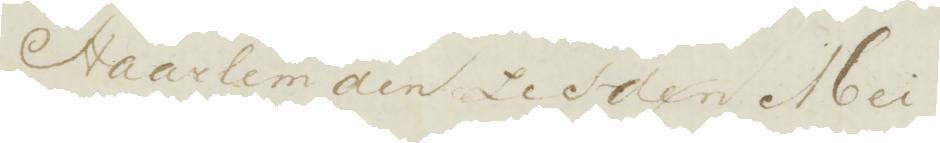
Haarlem den zesden Mei
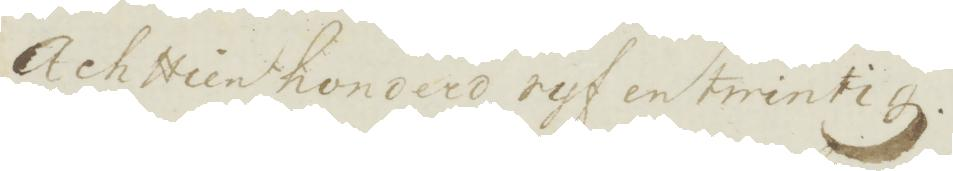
Achttien honderd vyf en twintig.
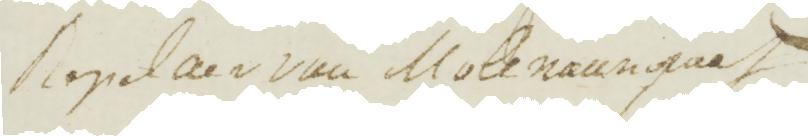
kapelaan van Molenaarsgraaf
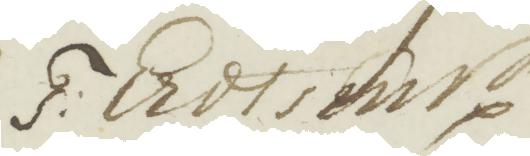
F: Erdtseick
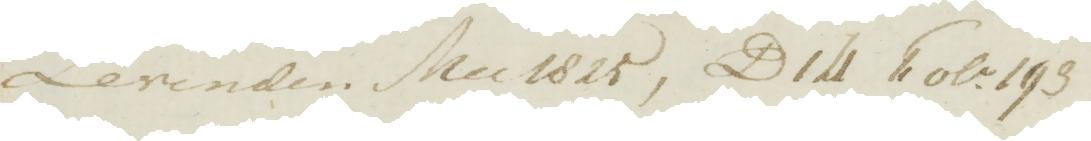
Zevenden Mei 1825, D14 Fol.o 193
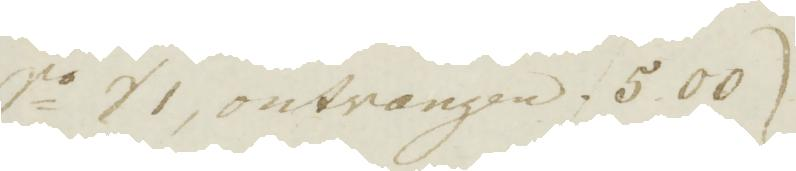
V=o 71, ontvangen ƒ5.00
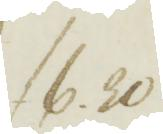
ƒ6.30
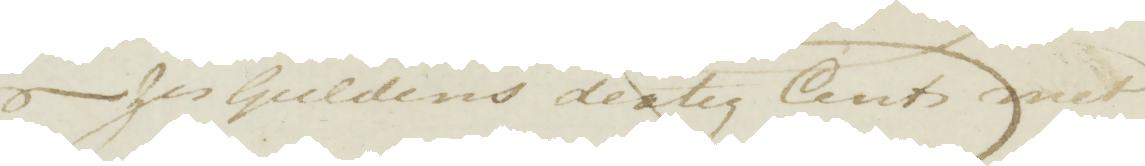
Zes Guldens dertig Cents met
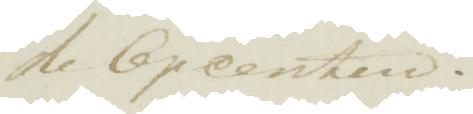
de Opcenten.
